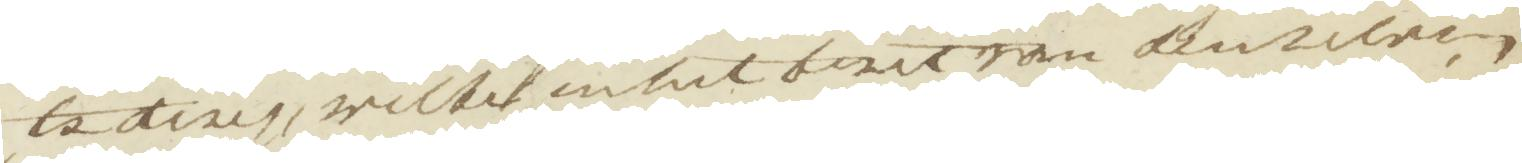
te dezes, welke in het bezit van denzelven
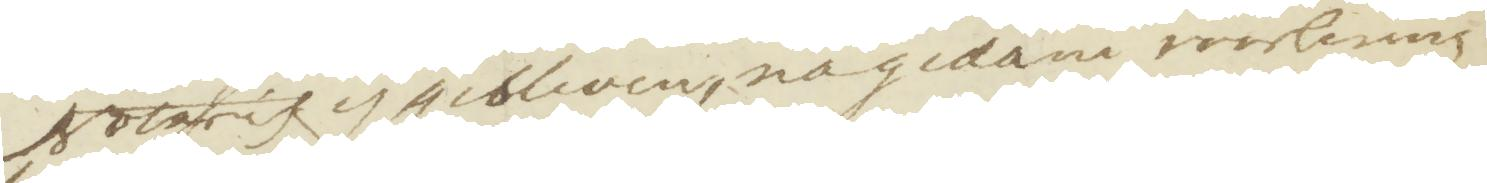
Notaris is gebleven, na gedane voorlezing
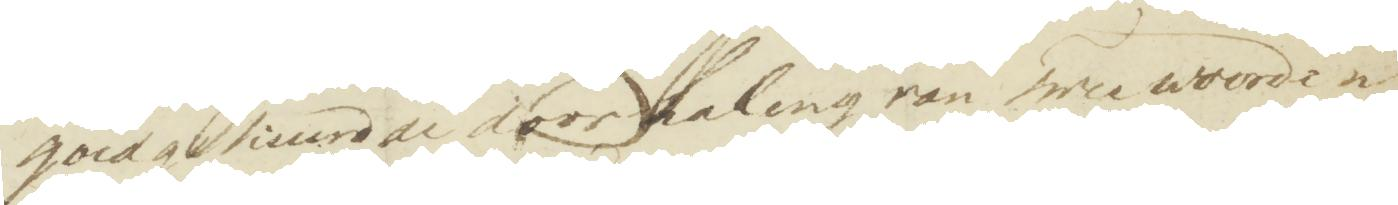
goedgekeurd de door haling van Twee woorden
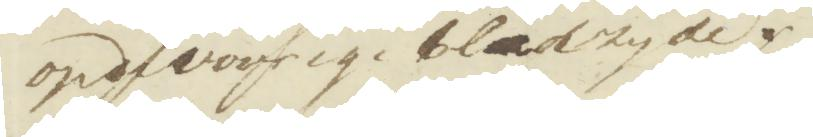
op de voorige bladzyde.
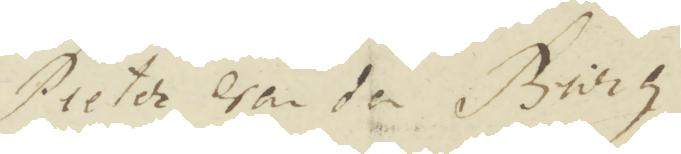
Pieter van den Burg
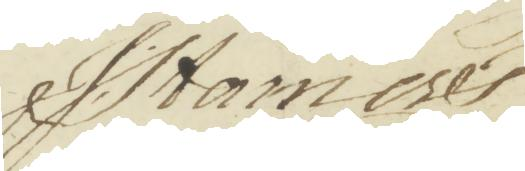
J. Stamers
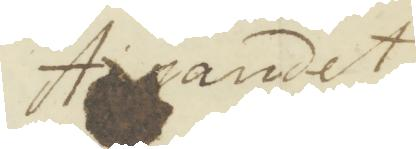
A: randet
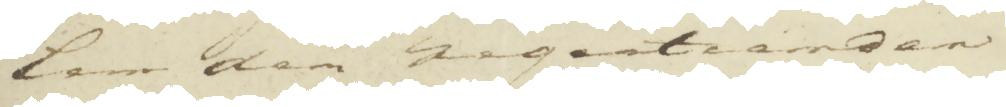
lem den negentienden
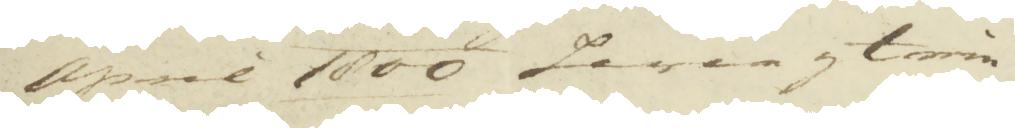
April 1800 zeven en twin
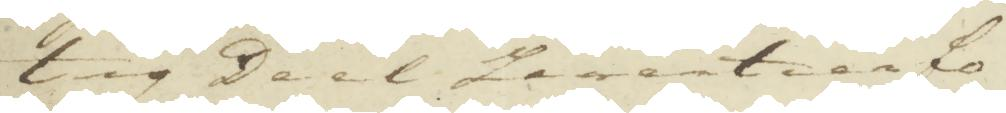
tig Deel Zeventien fo
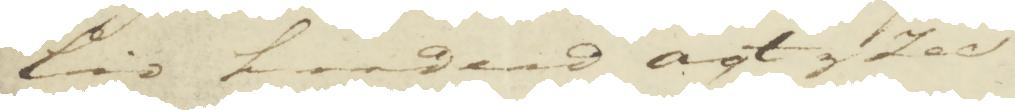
lio honderd agt en Zes
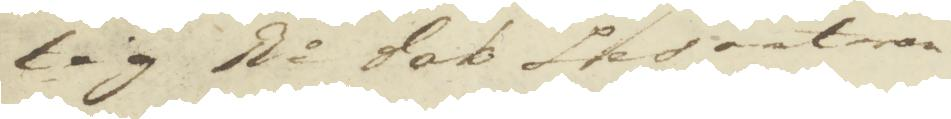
tig N=o Vak ses ontvan
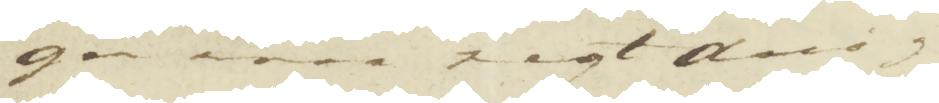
gen voor regt drie en
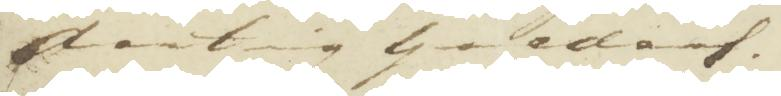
dertig Guldens.
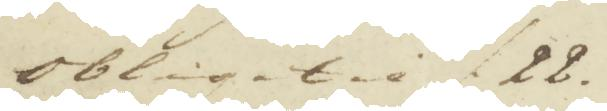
obligatie ƒ 22.
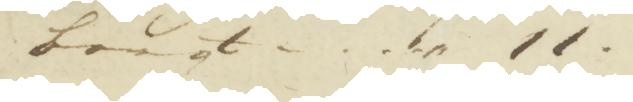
bongt . . . . „ 11.
